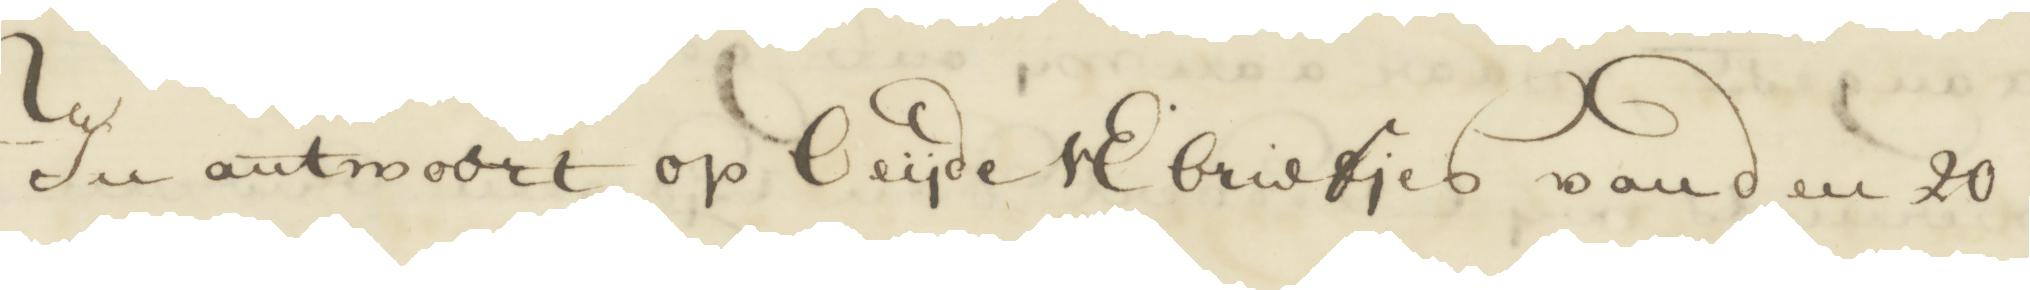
In antwoort op beijde uE briefjes van den 20
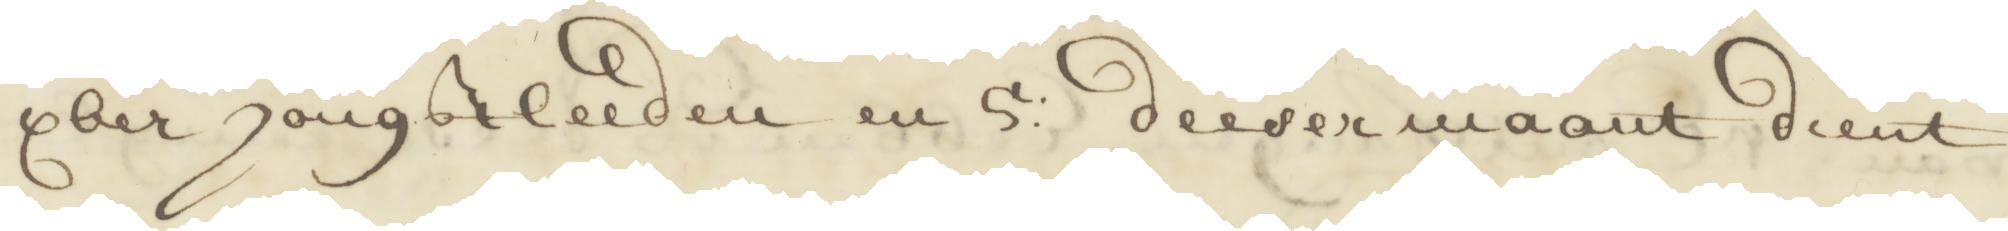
xber jongstleeden en 5:e deeser maant dient
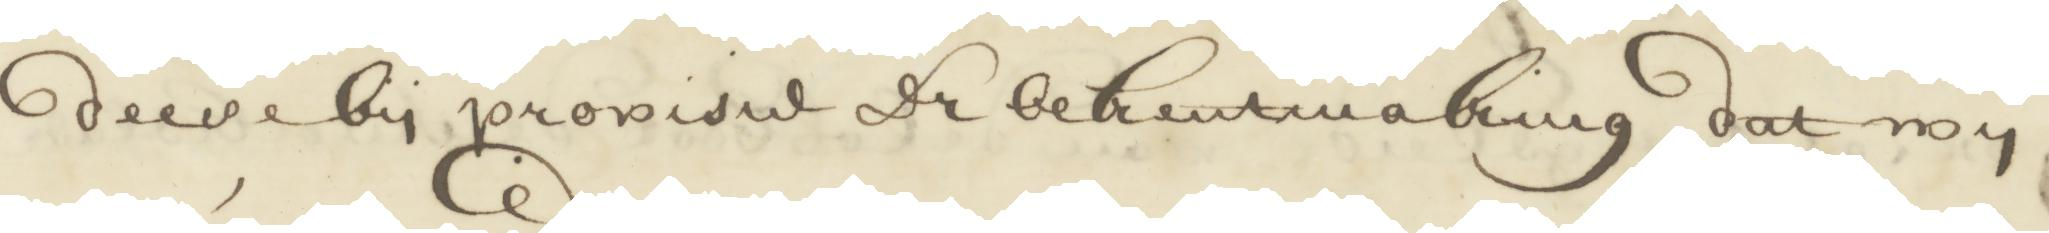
deese bij provisie der bekentmaking dat wij
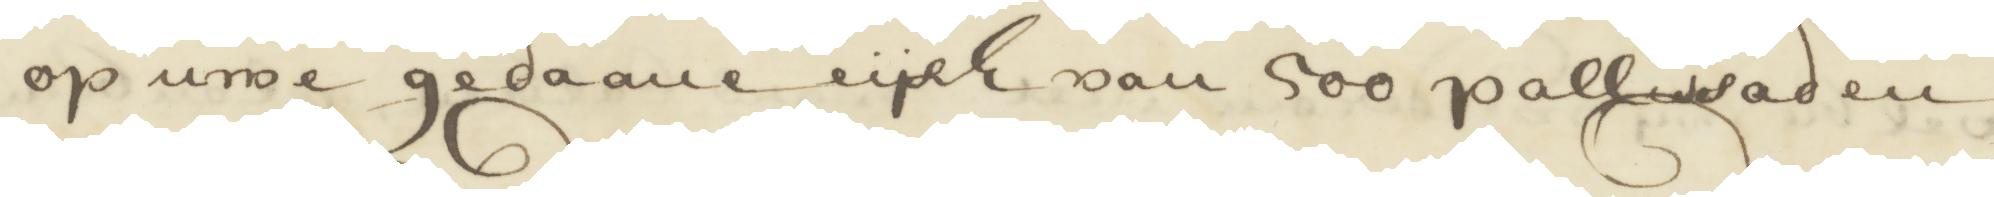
op uwe gedaane eijsch van 500 pallissaden
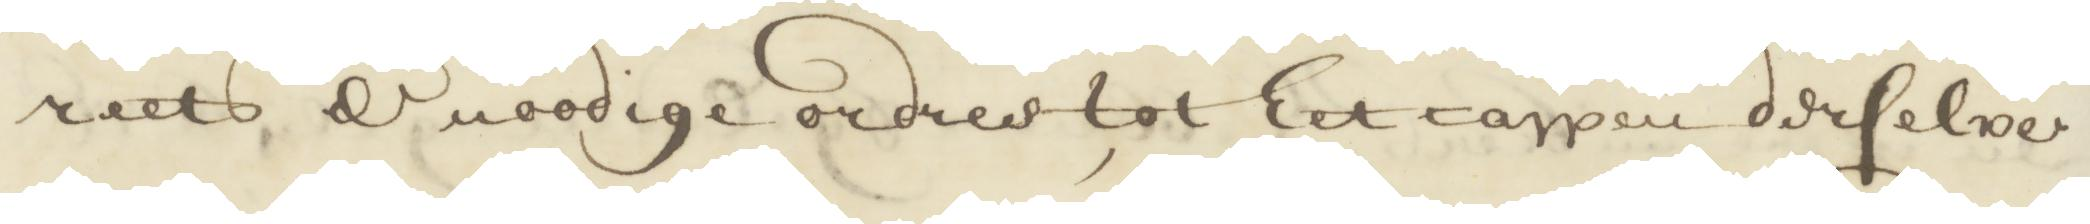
reets de noodige ordres tot het cappen derselve
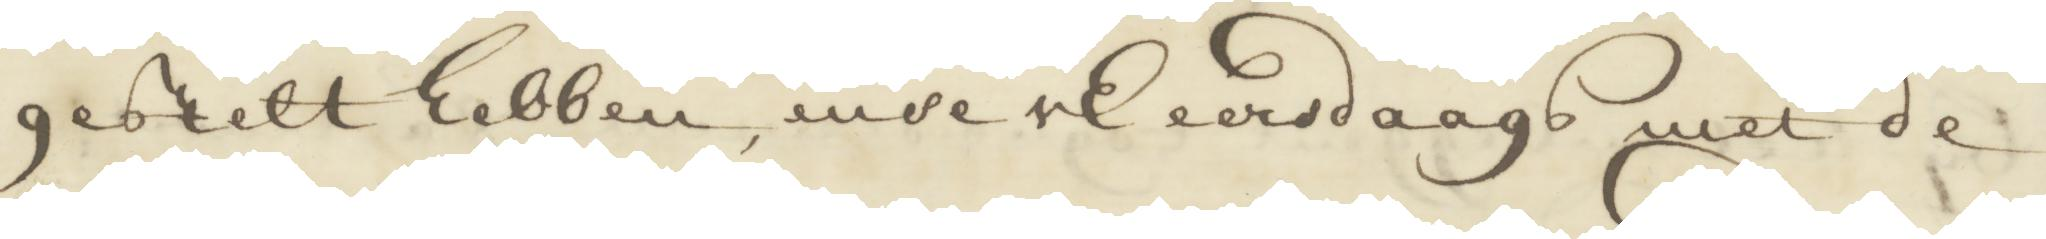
gestelt hebben, ende uE eersdaags met de
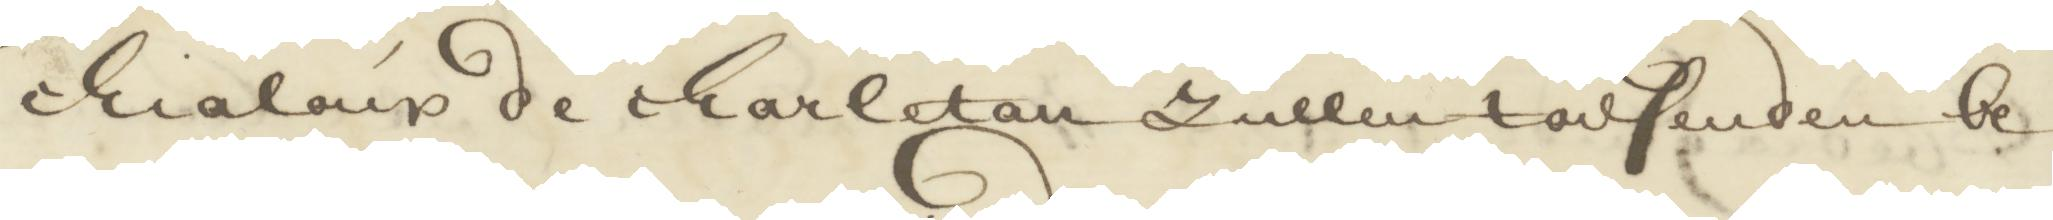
chialoup de charletan zullen toesenden be
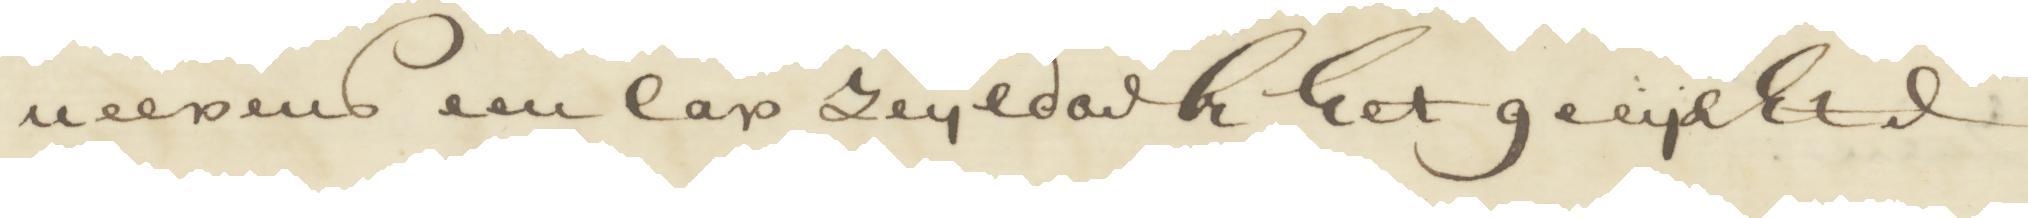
neevens een lap zeijldoek het geeijschte
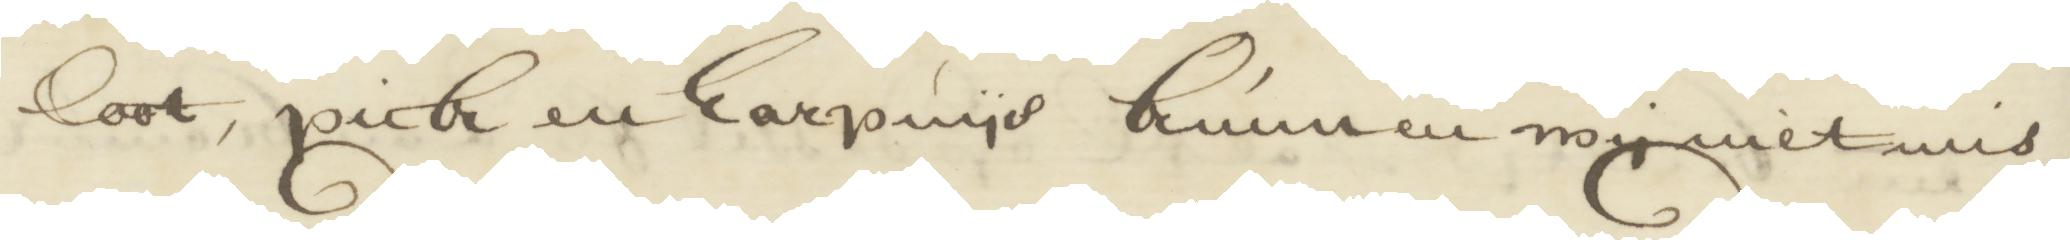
loot, pick en harpuijs kunnen wij niet mis
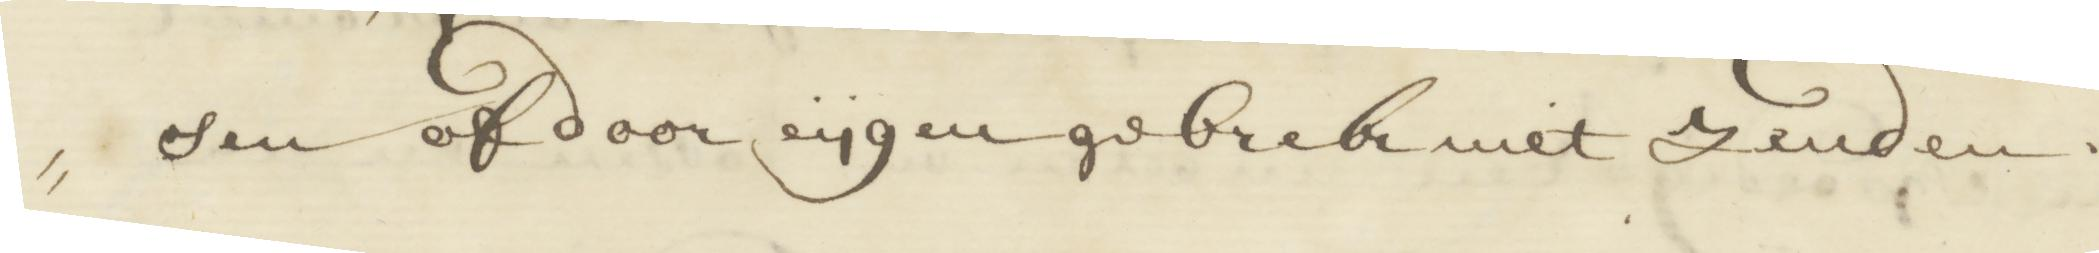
„ sen of door eijgen gebrek niet zenden.
